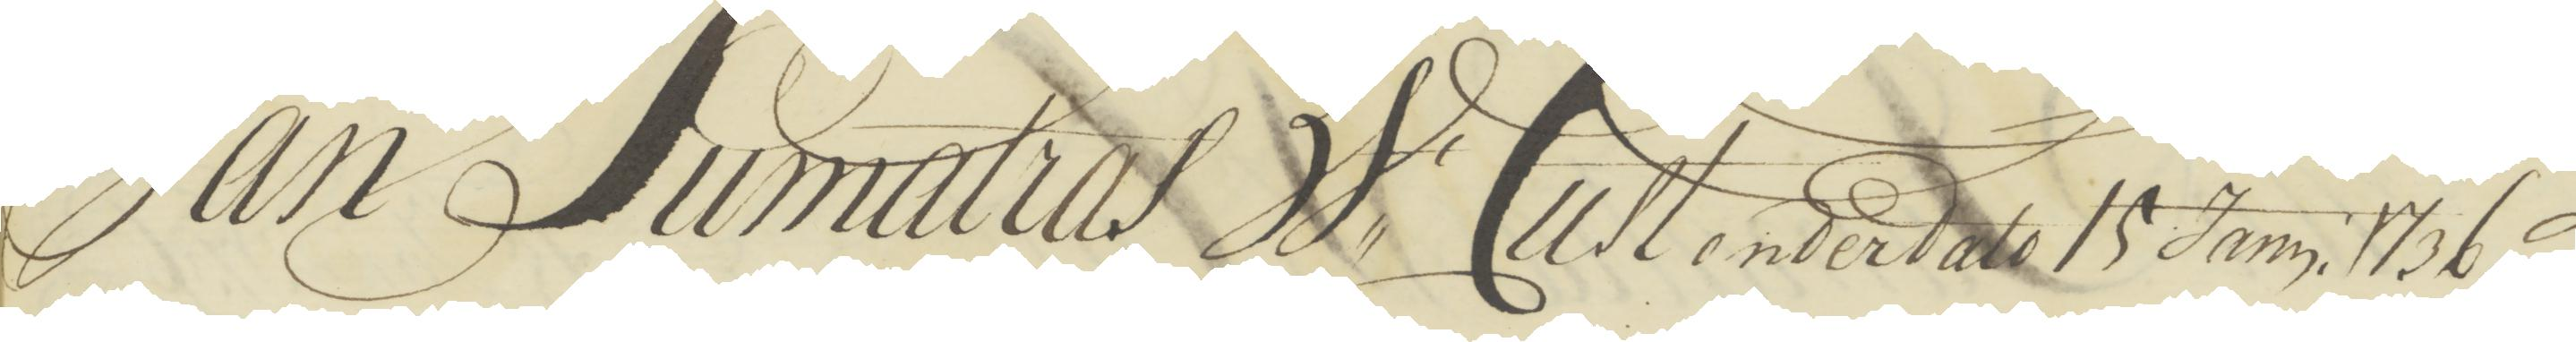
Van Sumatras W„t Cust onder dato 15. Jany: 1736
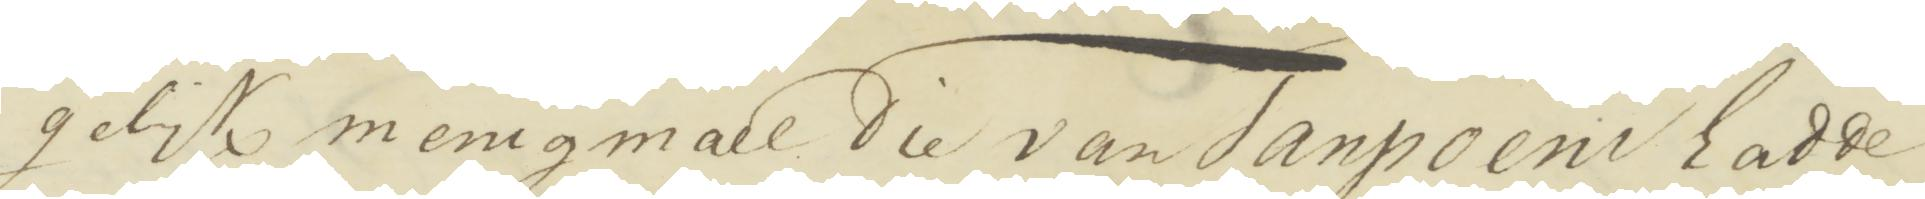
gelijk menig mael die van Tanpoem hadde
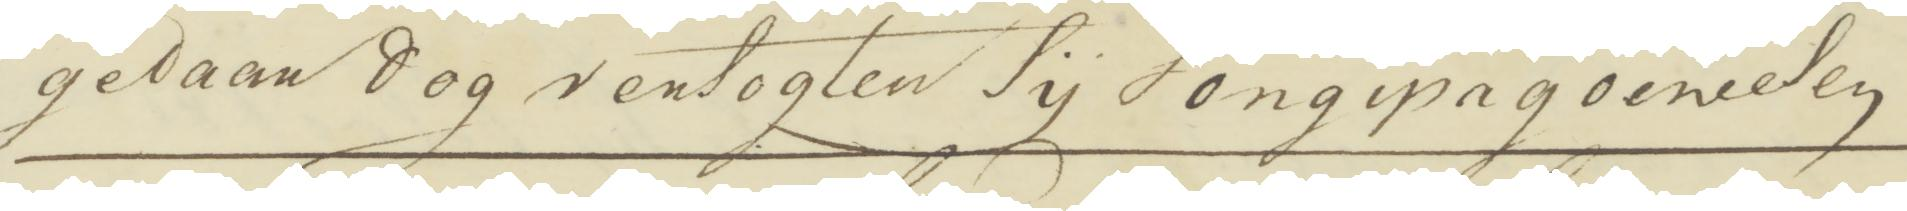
gedaan dog versogten Sij Songipagoeneesen
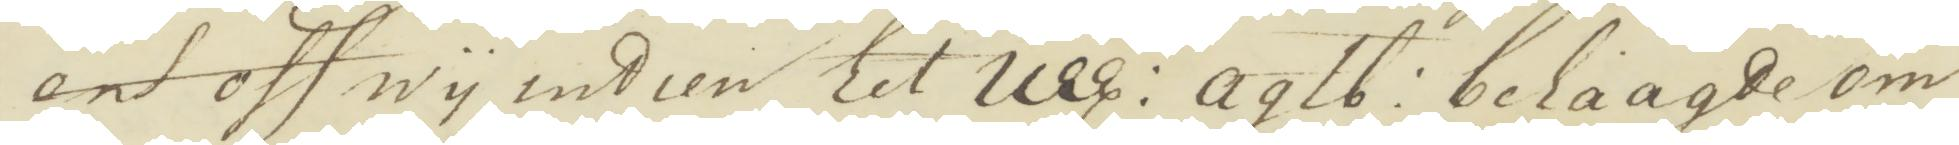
ons off wij indien het UEE: agtb: behaagde om
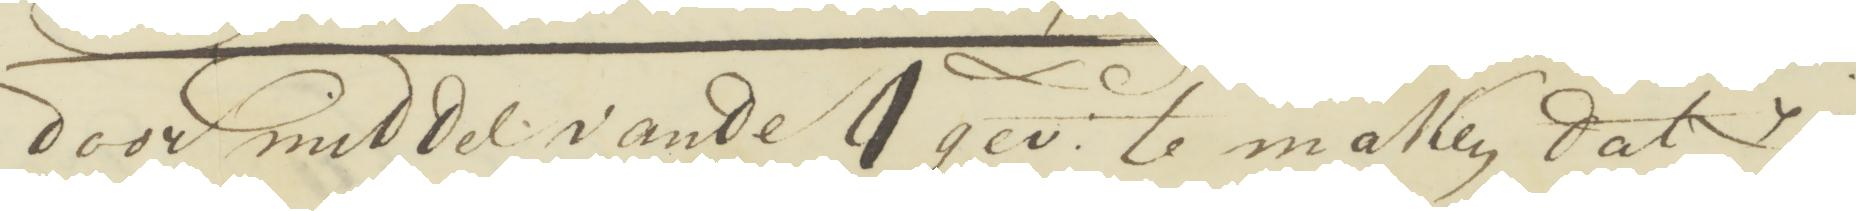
door middel van de 4 gen: te maken dat zij
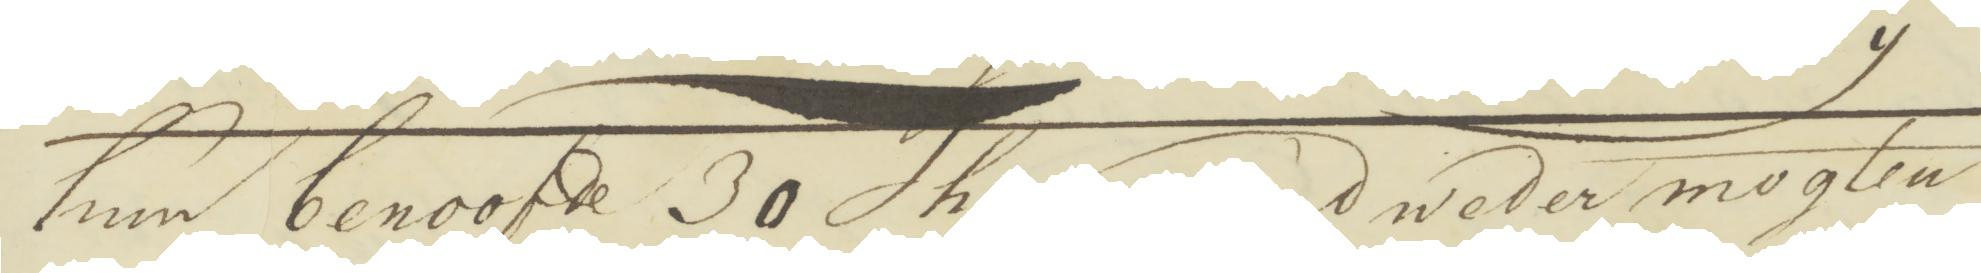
hun beroofde 30 Thaelen goud weder mogten
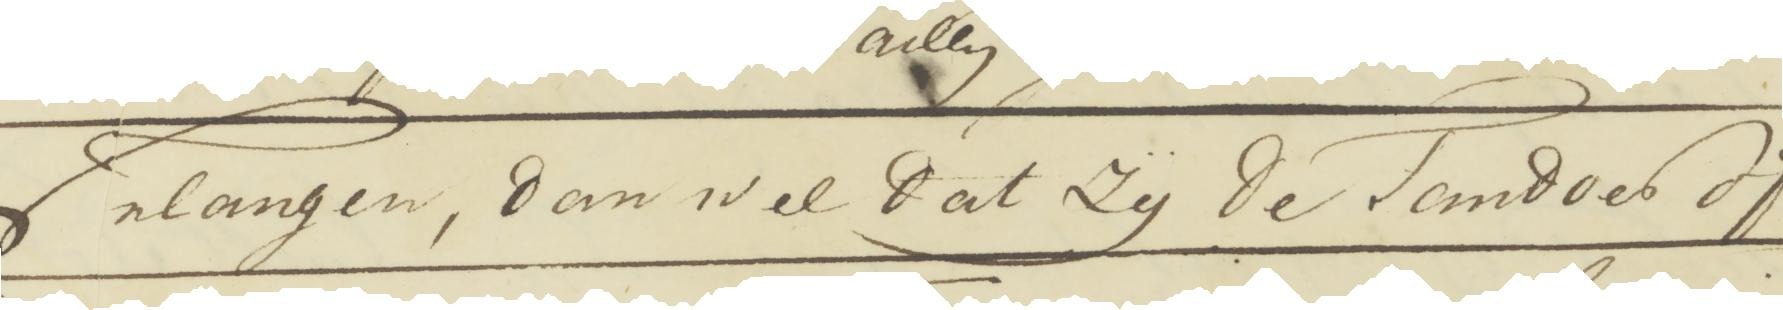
Erlangen, dan wel dat zij de Tandoes o
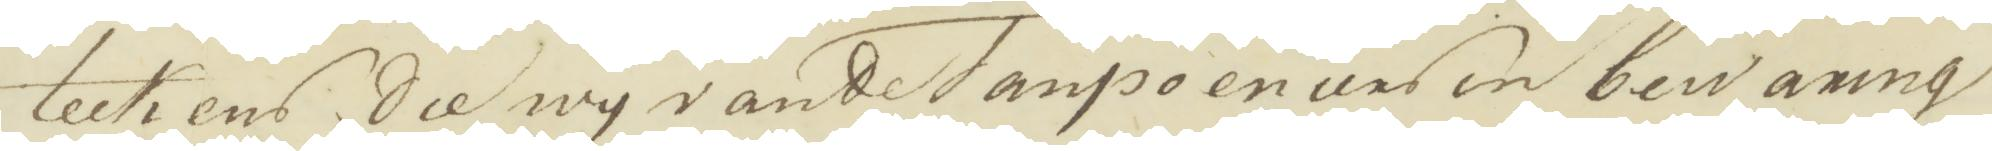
teekens die wij van de Tanpoeniers in bewaring
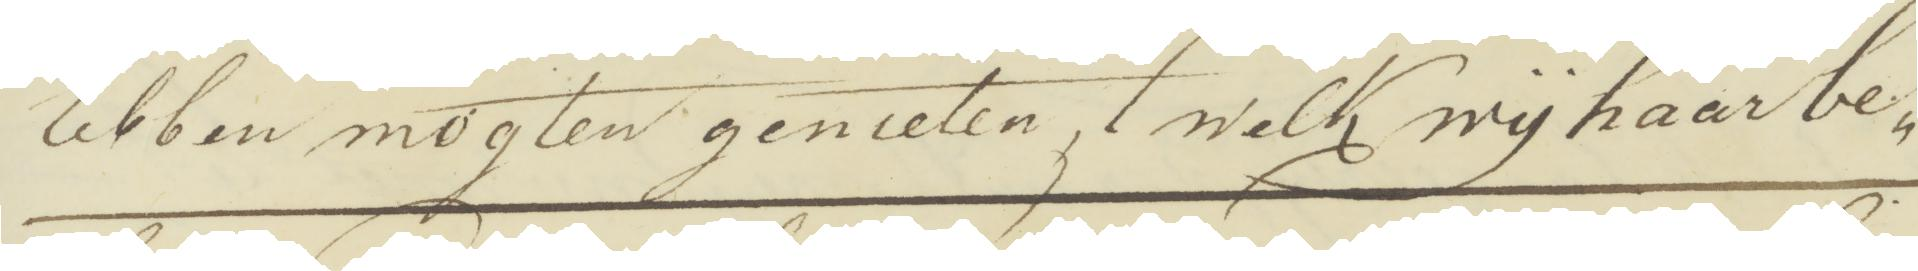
hebben mogten genieten, ’t welk wij haar be
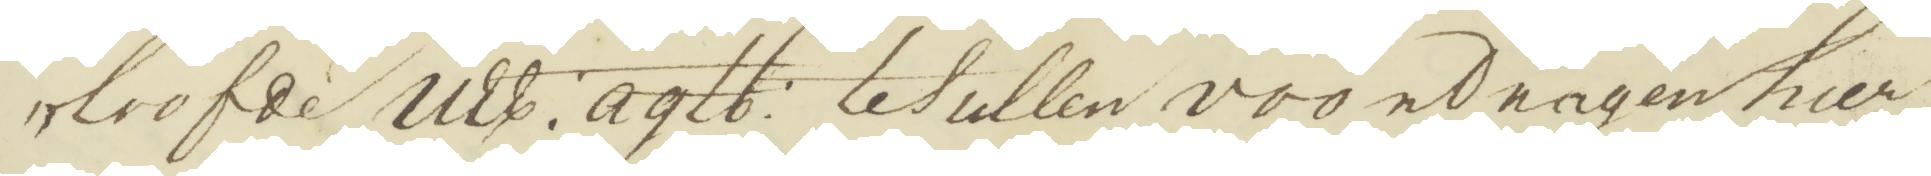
„loofde UEE: agtb: tesullen voordragen hier
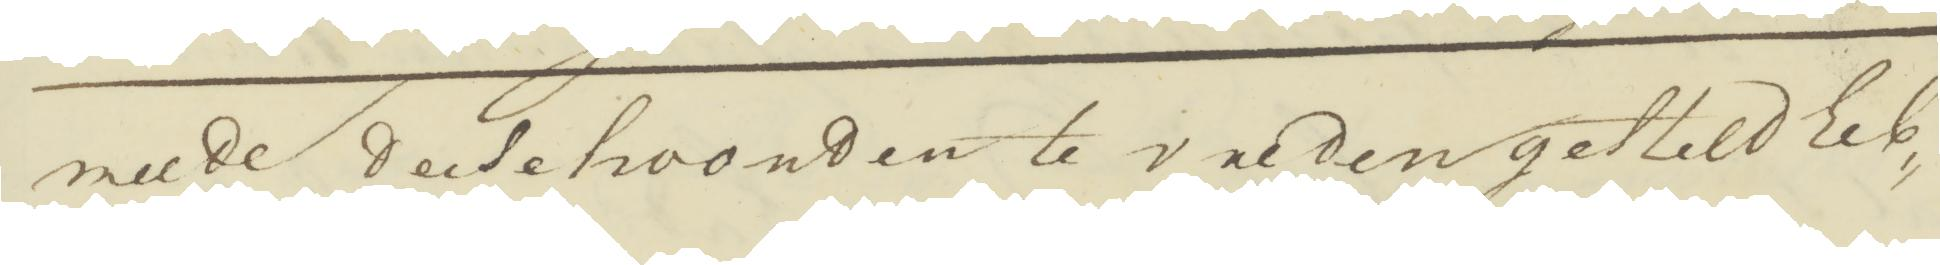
meede deese hoorden te vreden gesteld heb„
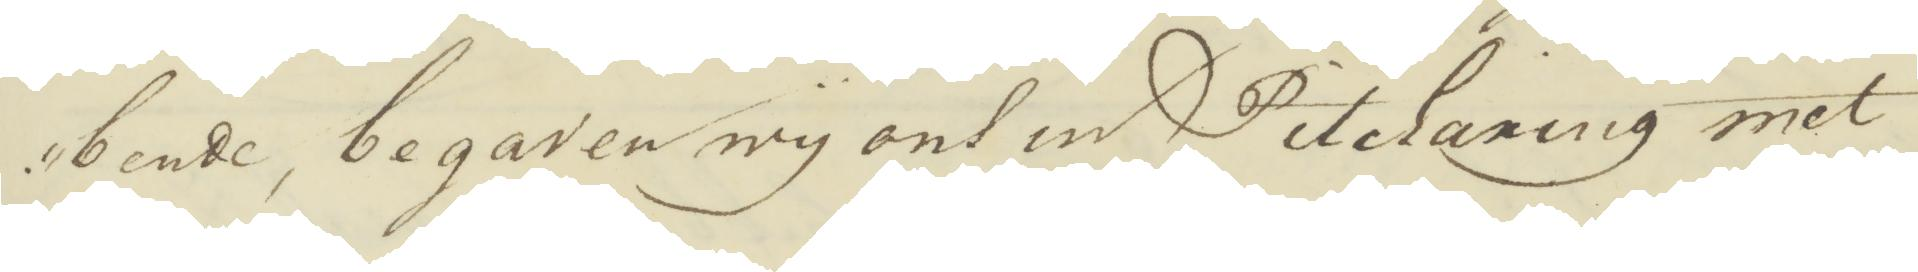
„bende, begaven wij ons in Pitcharing met
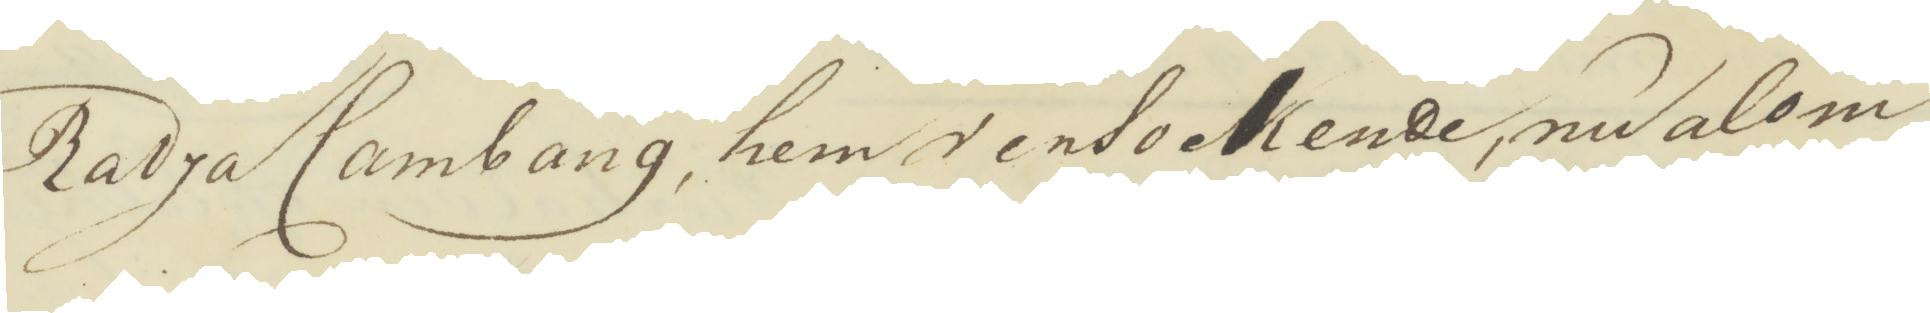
Radja Cambang, hem versoekende, nu alom
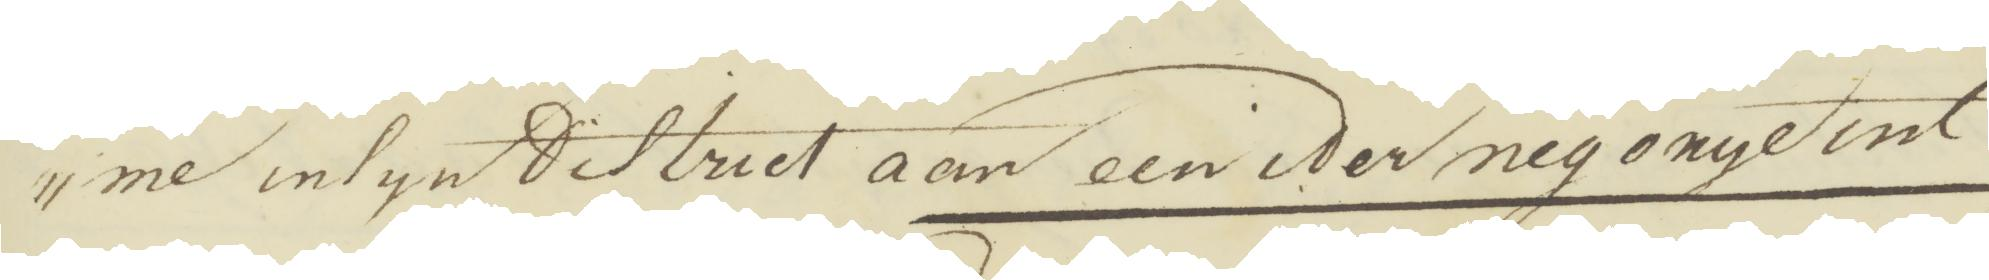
„me in syn district aan een ider negorye int
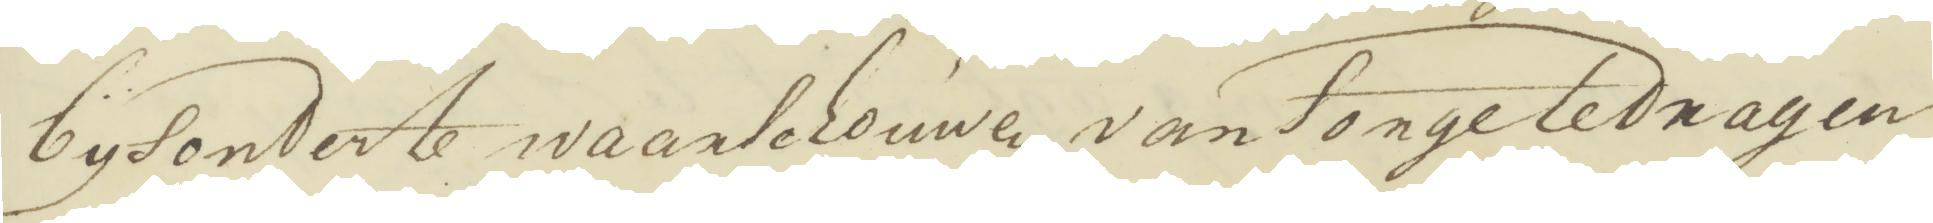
bijsonder te waarschouwen van Sorge tedragen
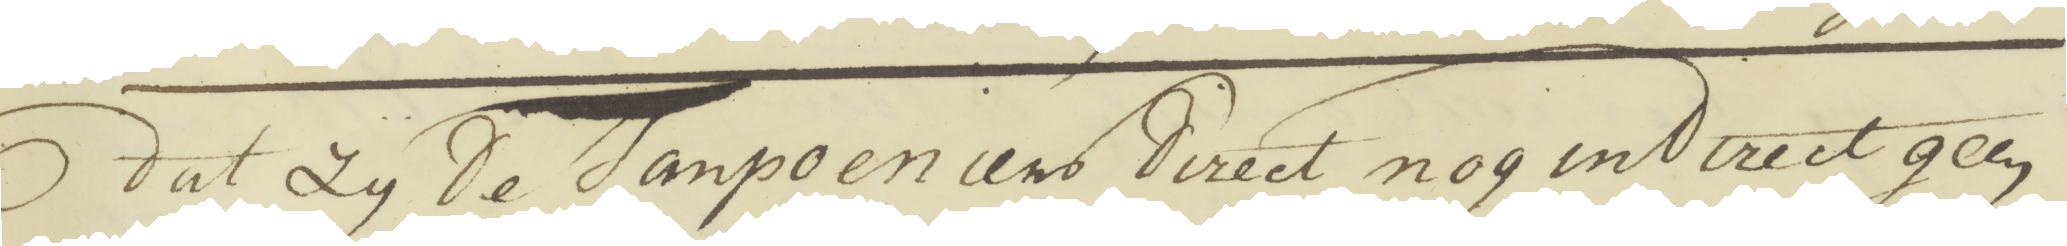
dat zij de Tanpoeniers direct nog indirect geen
